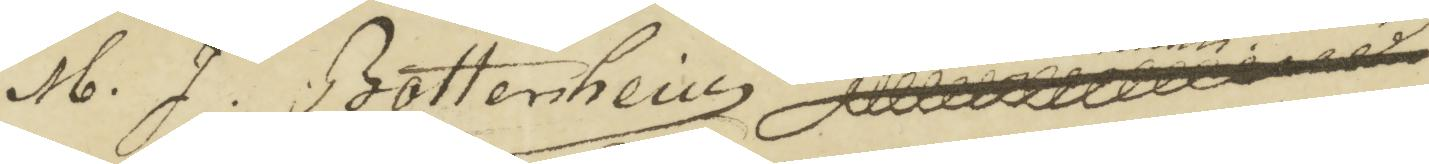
M. J. Bottenheim
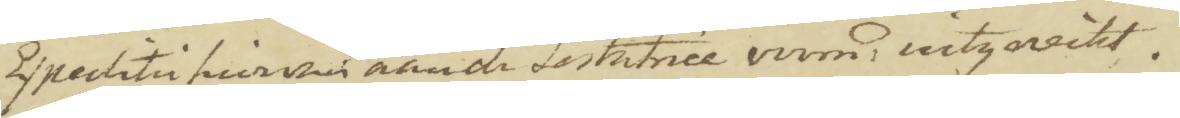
Expeditie hiervan aan de Testatrice voorn: uitgereikt.
